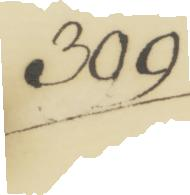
309
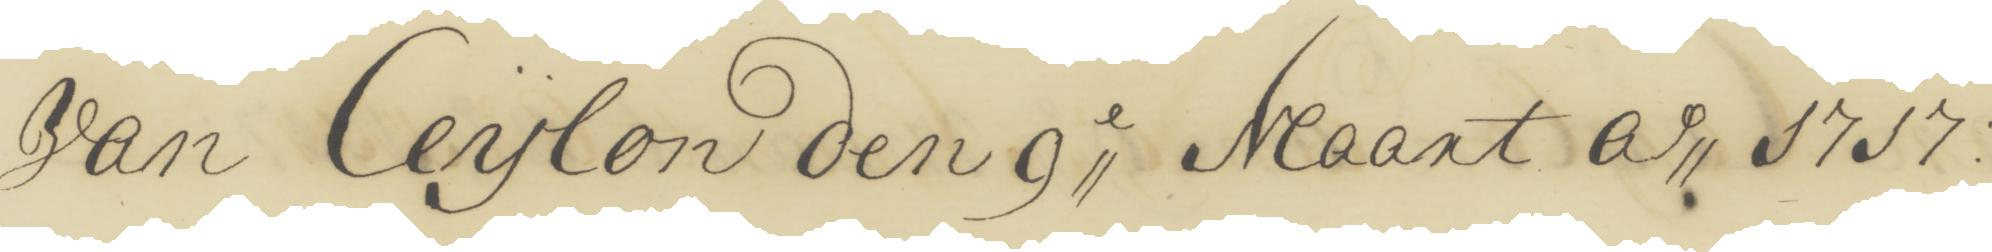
Van Ceijlon den 9„e Maart a„o 1717:
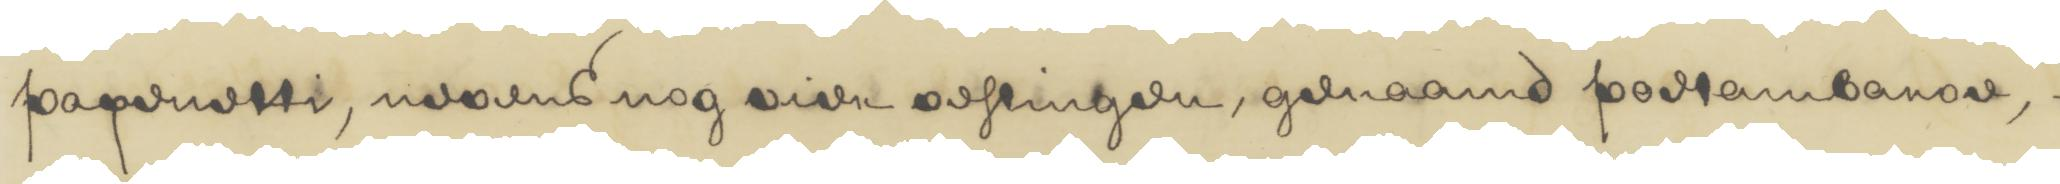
paperetti, nevens nog vier vestingen, genaamd poetambaroe,
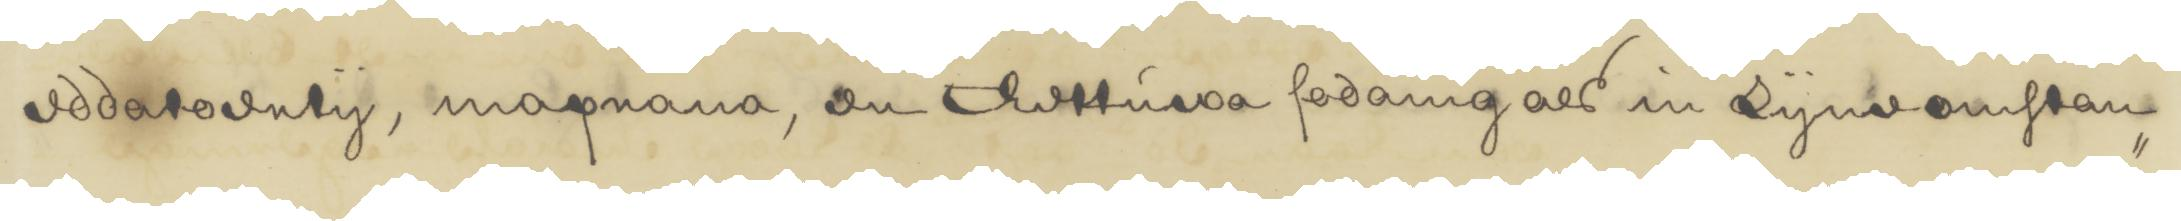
eddatoertij, maprana, en chettuwa sodanig als in zijne omstan„
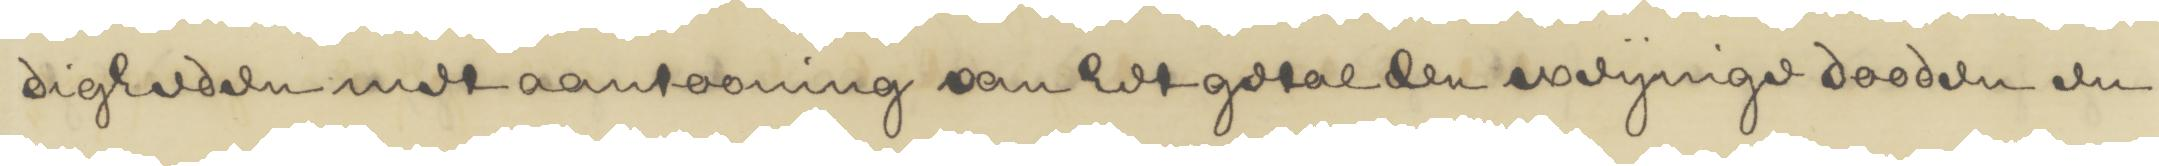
digheden met aantooning van het getal den weijnige dooden en
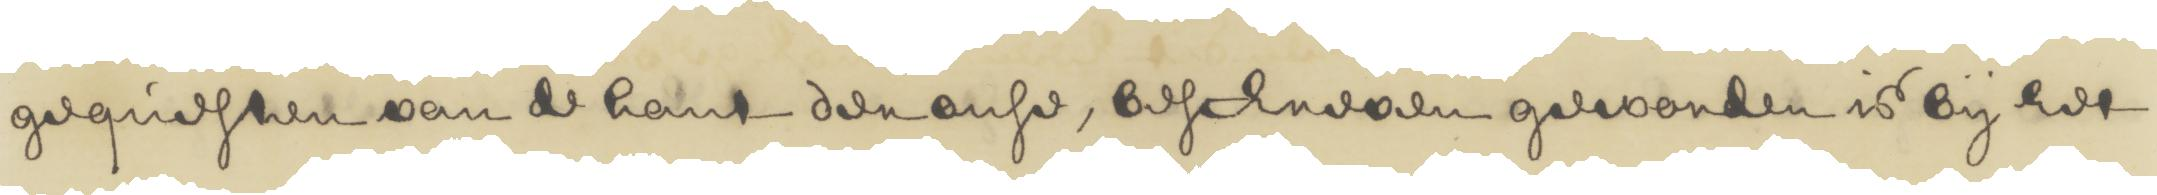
gequesten van de kant der onse, beschreven geworden is bij het
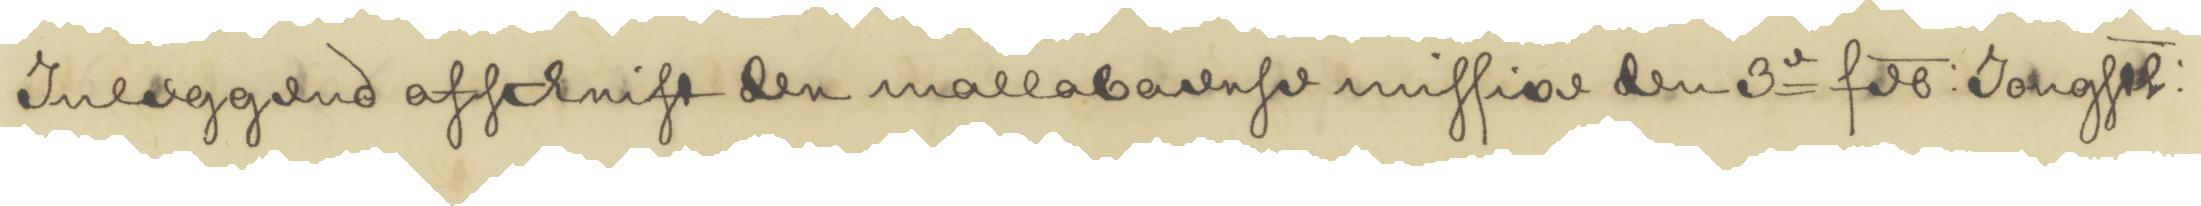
Inleggend afschrift der mallabaerse missive den 3=e feb: Iongstl:
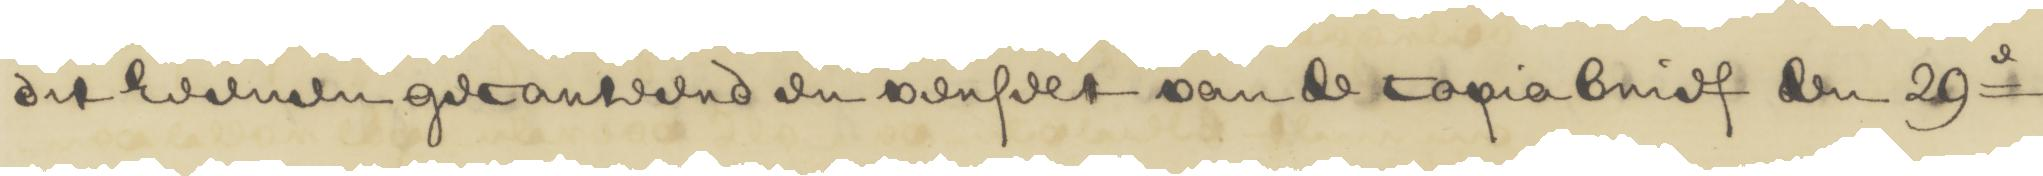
dit heenen gecanteerd en verselt van de copia brief den 29=e
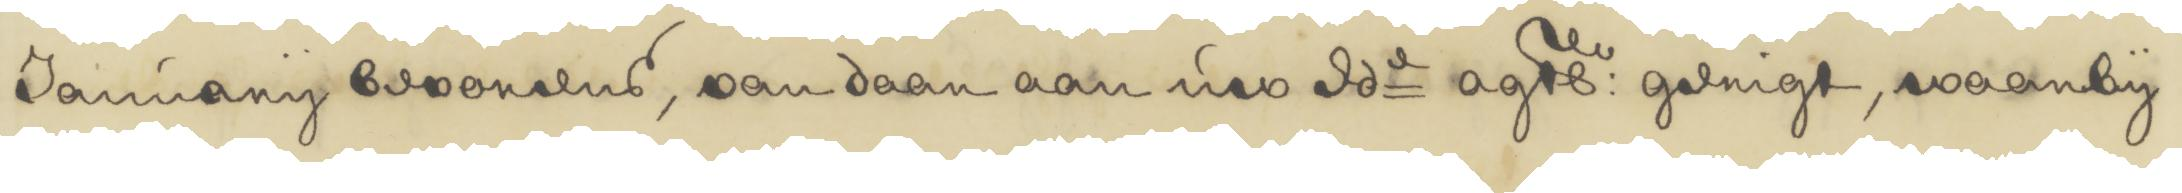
Ianuarij bevorens, van daar aan uw Ed=e agtb: gerigt, waarbij
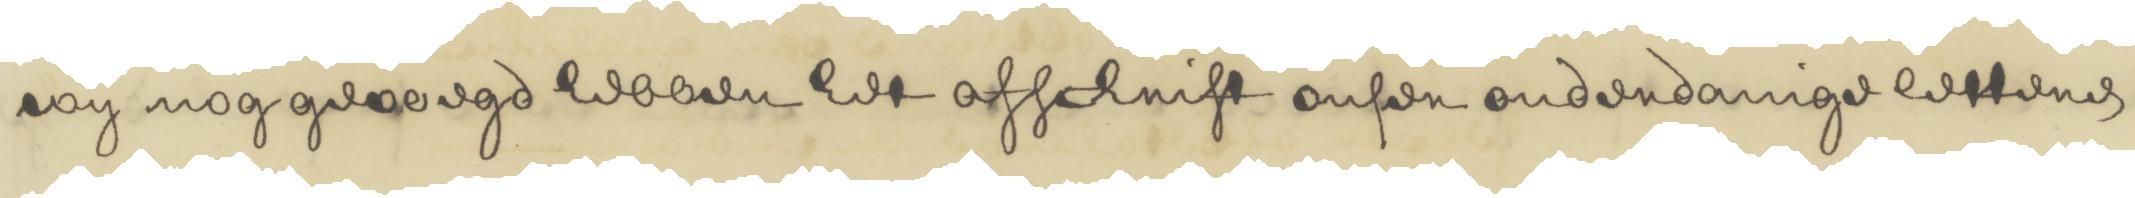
wij nog gevoegd hebben het afschrift onser onderdanige letteren
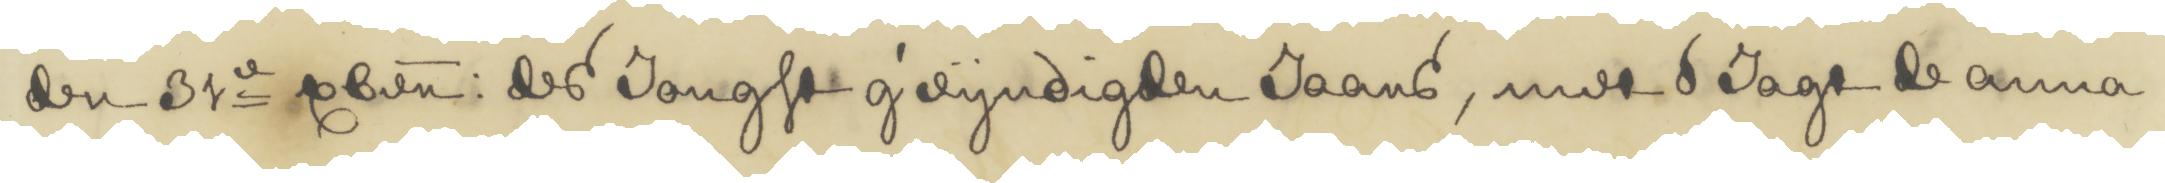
den 31=e xber: des Iongst g’eijndigden Iaars, met 't Iagt de anna
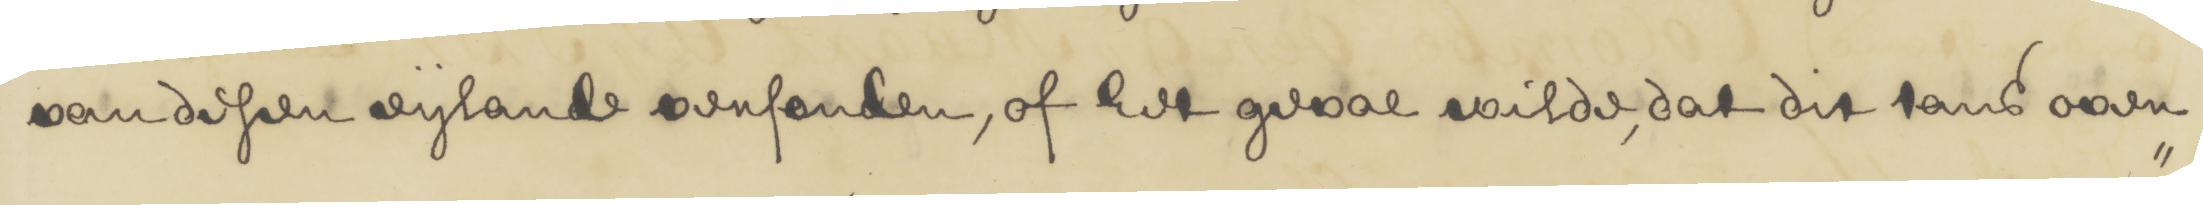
van desen eijlande versonden, of het geval wilde, dat dit tans over„
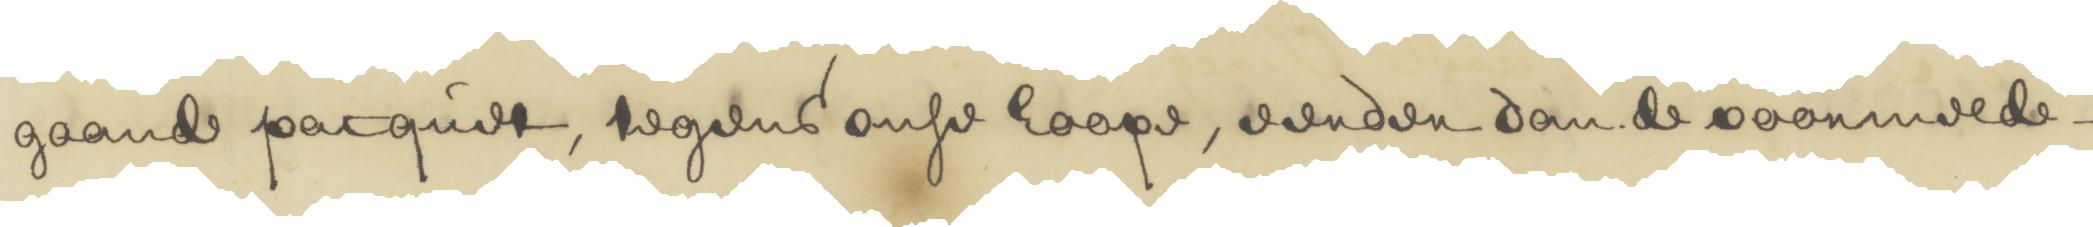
gaande pacquet, tegens onse hoope, eerder dan de voormelde
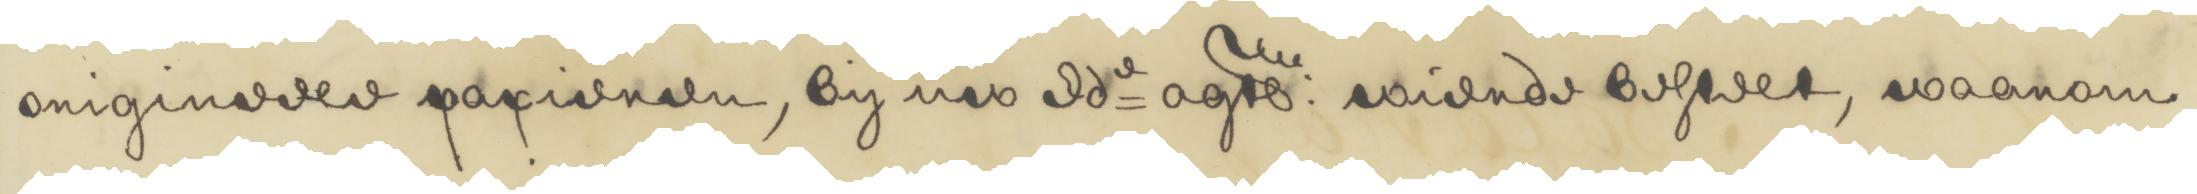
origineele papieren, bij uw Ed=e agtb: wierde bestelt, waarom
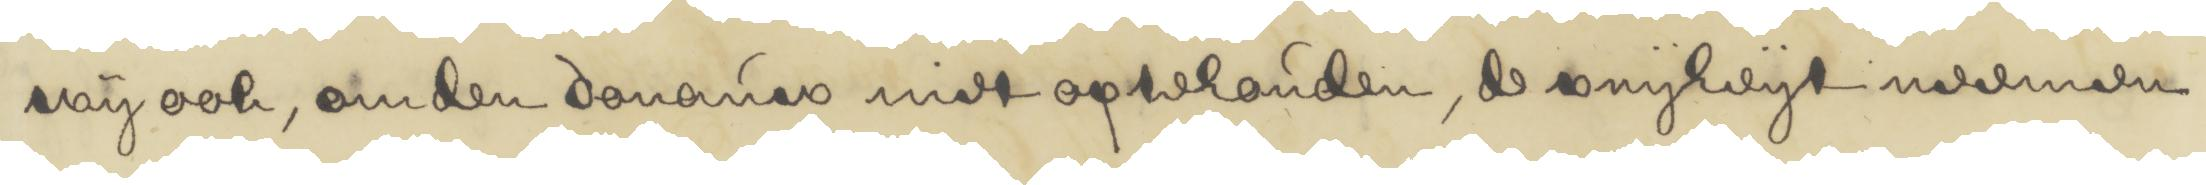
wij ook, om den donauw niet op te houden, de vrijheijt neemen
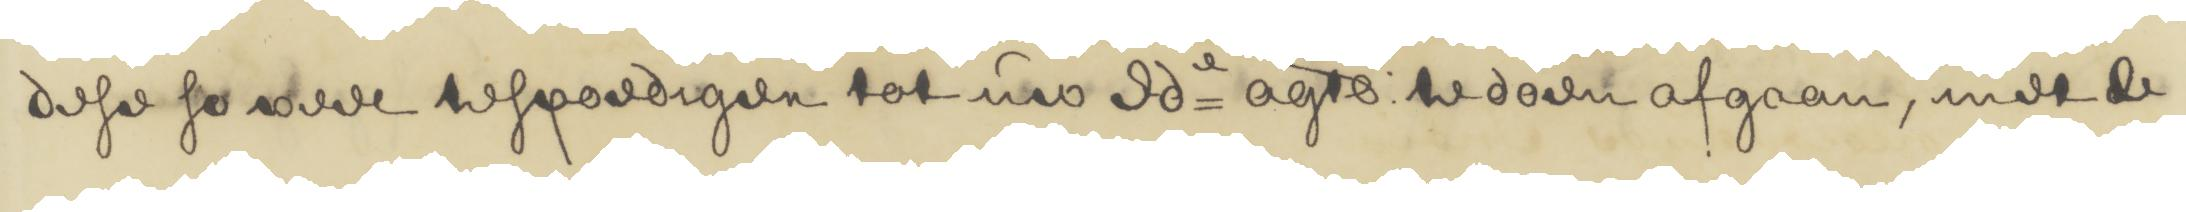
dese so veel tespoediger tot uw Ed=e agtb: te doen afgaan, met de
